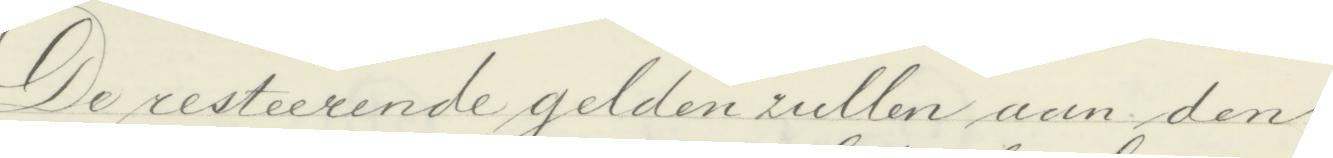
De resteerende gelden zullen aan den
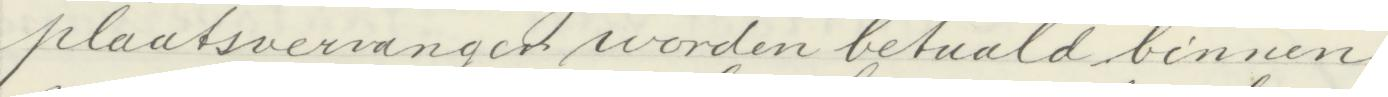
plaatsvervanger worden betaald, binnen
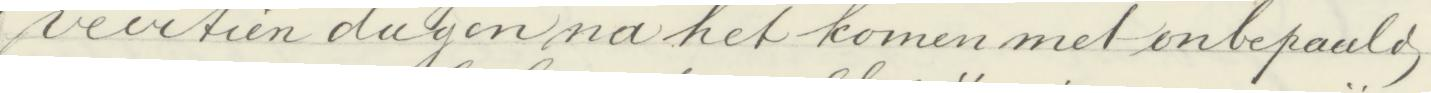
veertien dagen na het komen met onbepaald
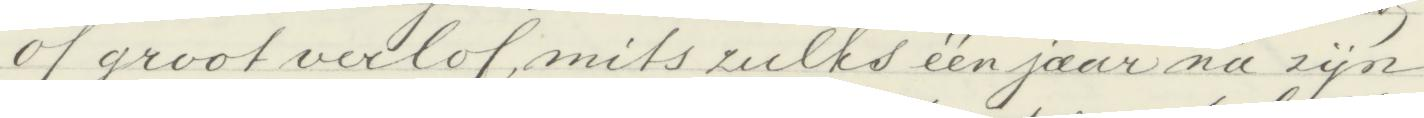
of groot verlof, mits zulks één jaar na zijn
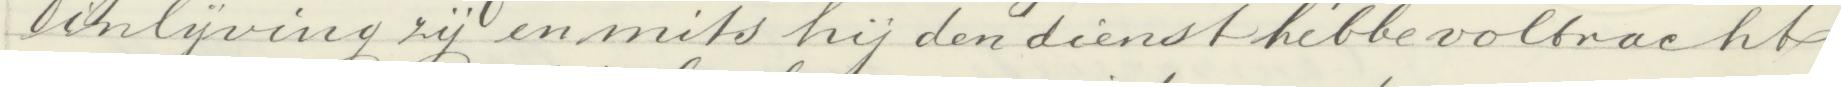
inlijving zij en mits hij den dienst hebbe volbracht
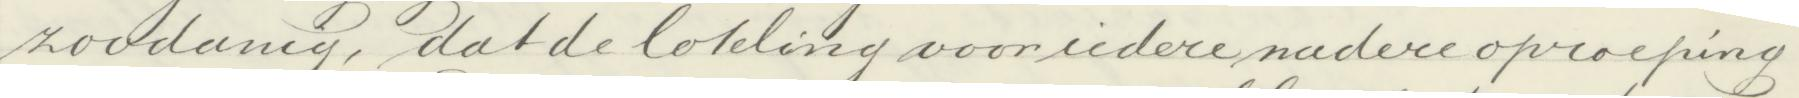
zoodanig, dat de loteling voor iedere nadere oproeping
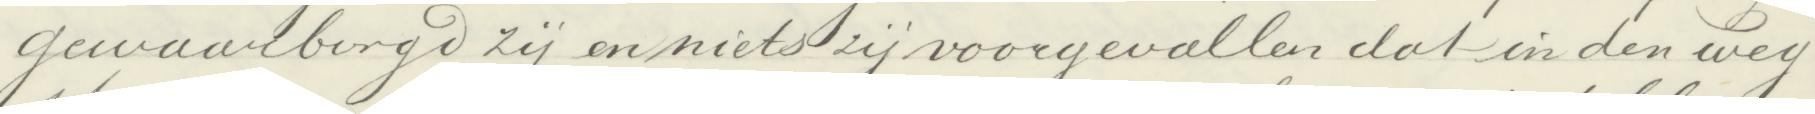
gewaarborgd zij en niets zij voorgevallen dat in den weg
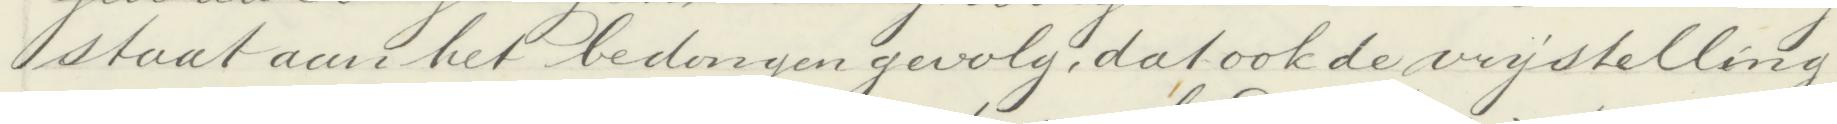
staat aan het bedongen gevolg, dat ook de vrijstelling
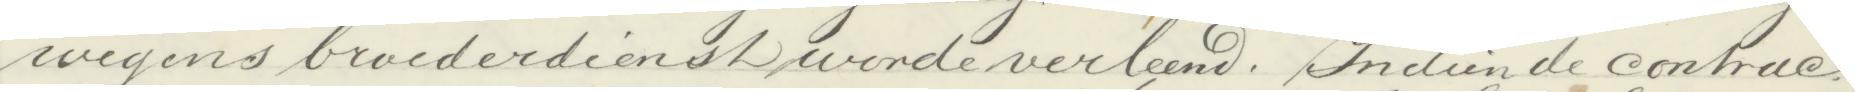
wegens broederdienst worde verleend. Indien de contrac,
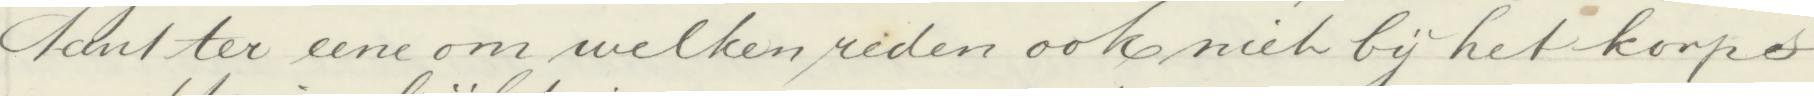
tant ter eene om welken reden ook niet bij het korps
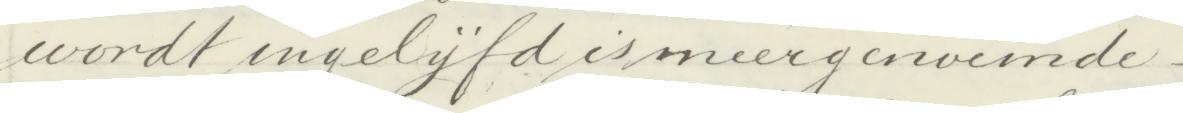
wordt ingelijfd is meergenoemde
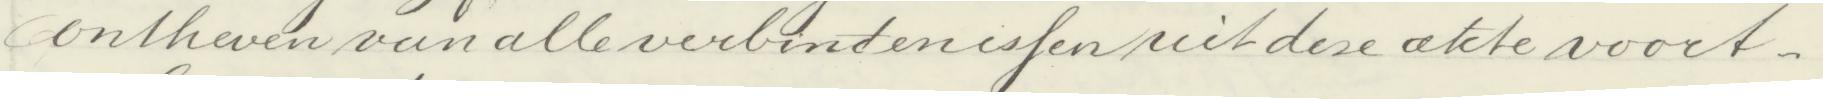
ontheven van alle verbindenissen uit deze akte voort-
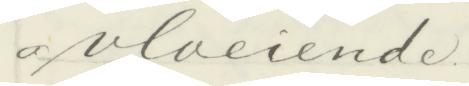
vloeiende.
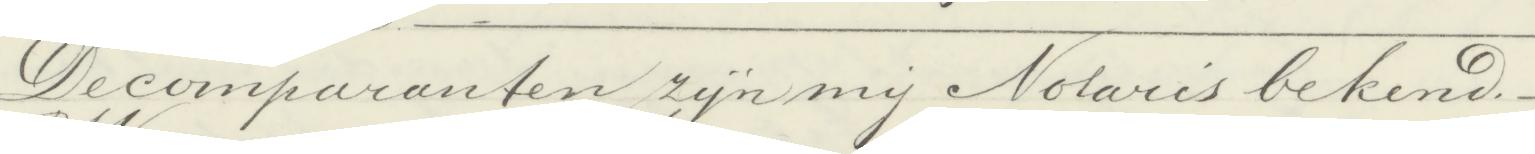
De comparanten zijn mij Notaris bekend.
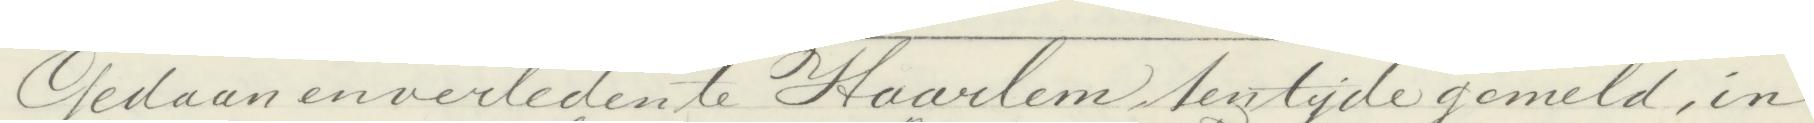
Gedaan en verleden te Haarlem ten tijde gemeld, in
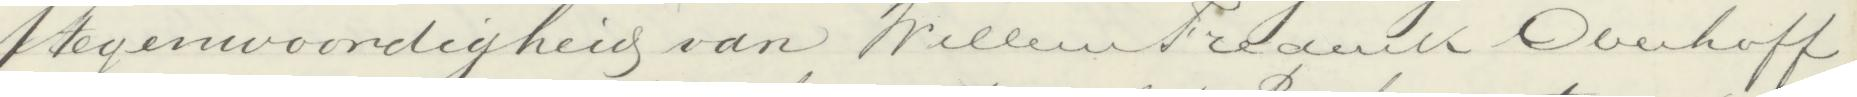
tegenwoordigheid van WillemFrederik Overhoff
